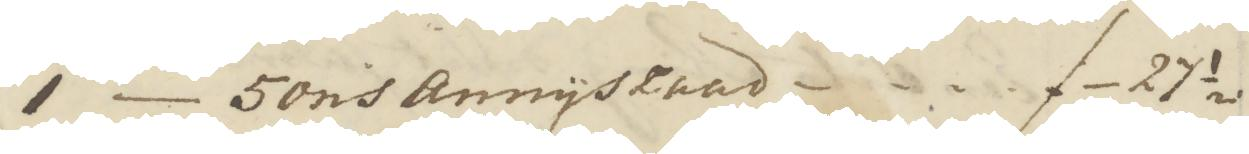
1 — 5 ons Annijszaad - - - . ƒ - 27½
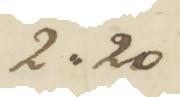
2. 20
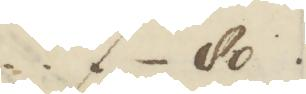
ƒ — 80
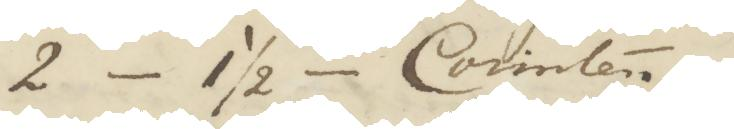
2 — 1½ — Corinten -
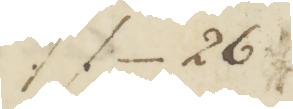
ƒ— 26.
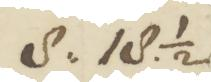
8„ 18½
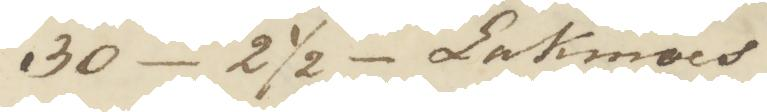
30 — 2½ — Lakmoes
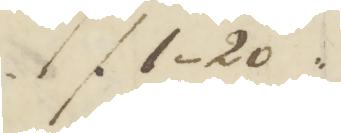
ƒ 1-20 :
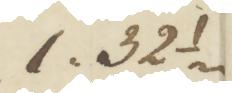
1: 32½
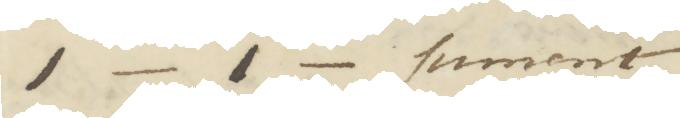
1 — 1 — piment
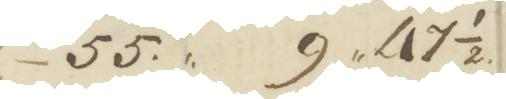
ƒ— 55. : 9 „ 47½
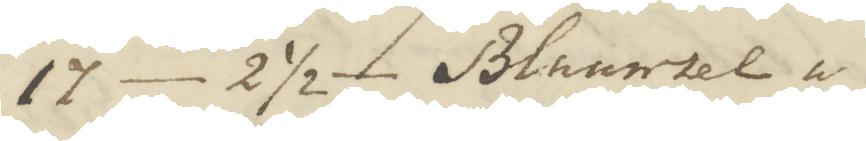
17 — 2½ — Blauwzel a
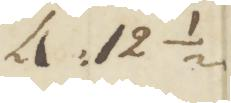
4:12½
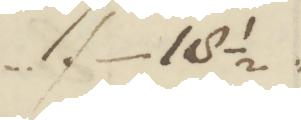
ƒ— 18½
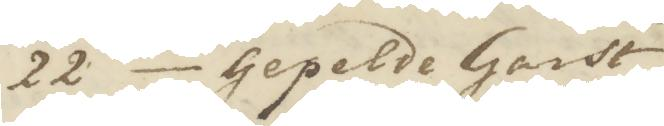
22 — Gepelde Garst
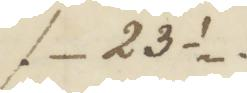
ƒ— 23½.
